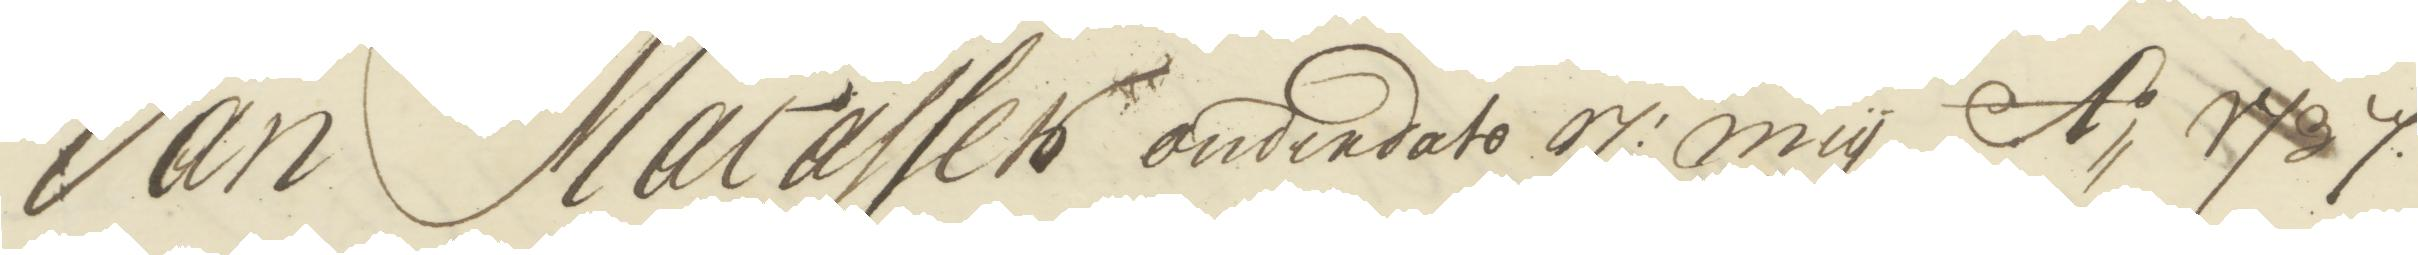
Van Macasser onder dato 17:' meij A„o 1737.
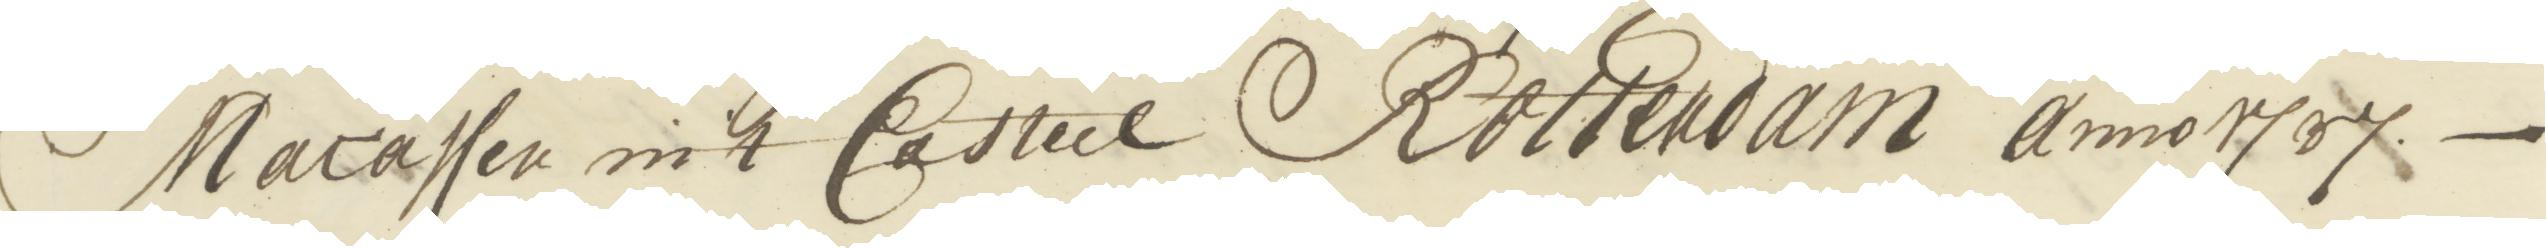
Macasser in’t Casteel Rotterdam anno 1737. —
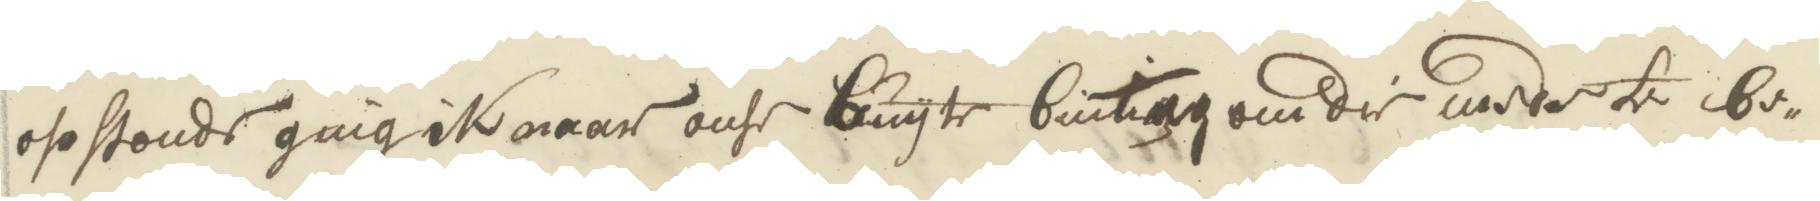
op stonds ging ik naar onse buijte binting om die mede te be„
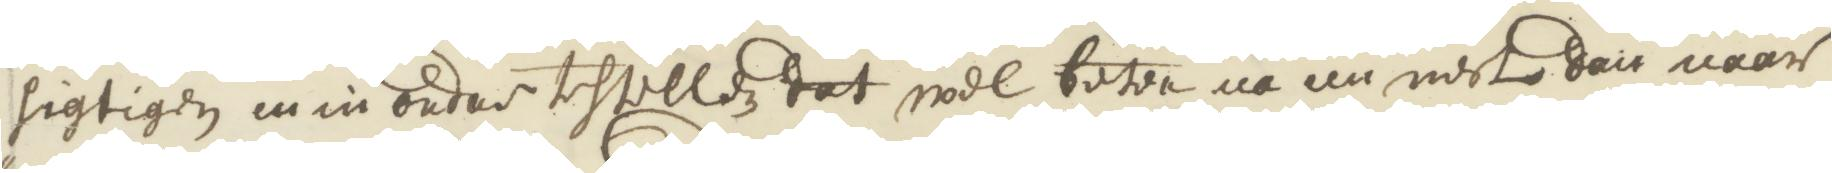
sigtigen en in ordre testellen dat wel beter na een nest dan naar
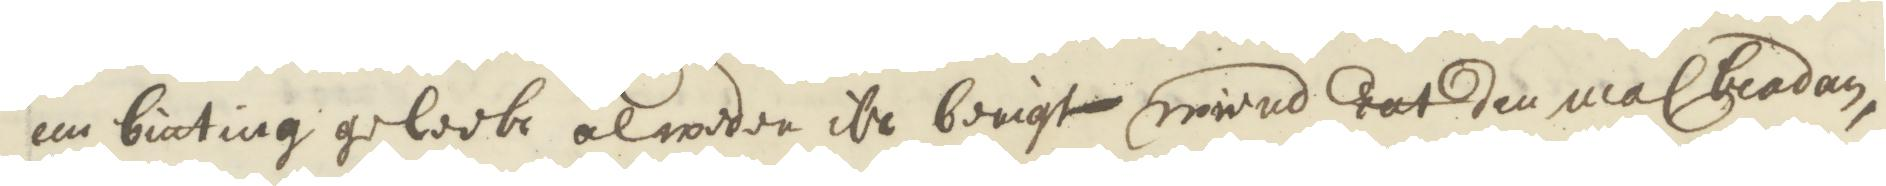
een binting geleek alweder ik berigt wierd dat den mackadan,
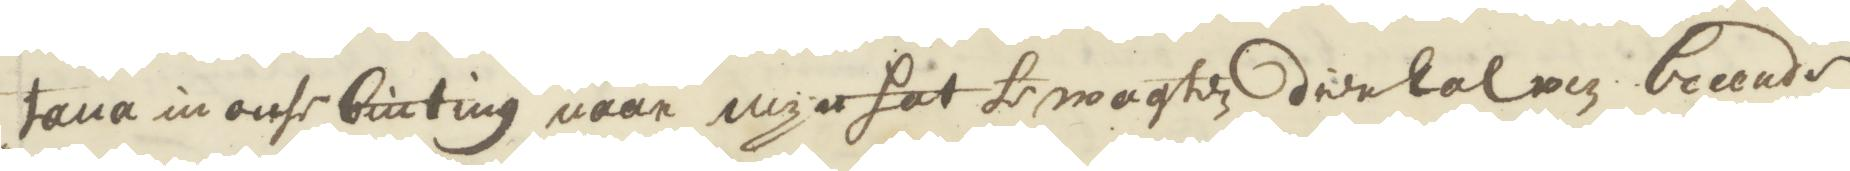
tana in onse binting naar mijn sat te wagten dierhalven keerde
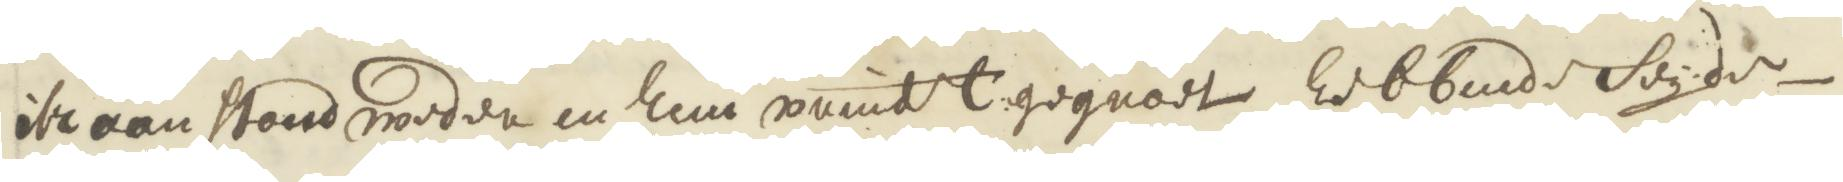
ik aan stond weder en hem vrindelijk gegroet hebbende seijde —
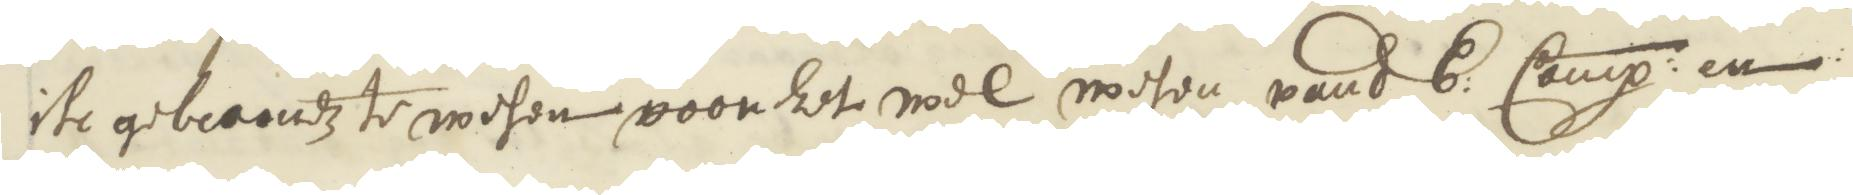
ik gekomen te wesen voor het wel wesen van dE: Comp: en
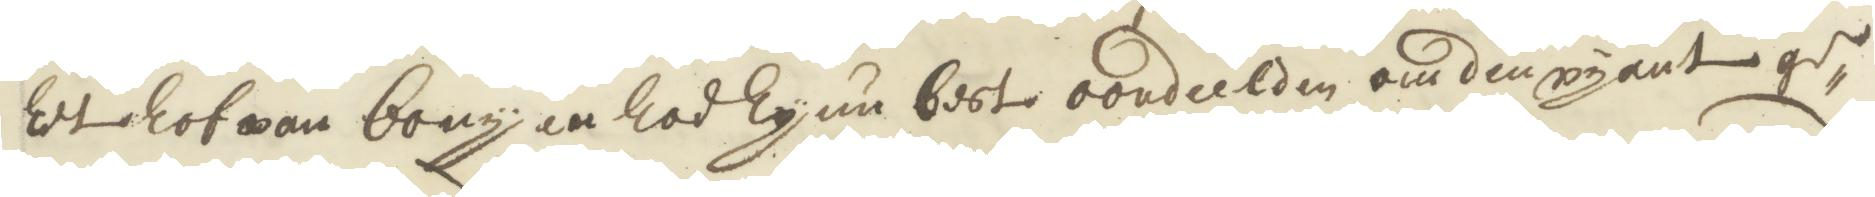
het hof van bonij en hoe hij nu best oordeelden om den vijant ge„
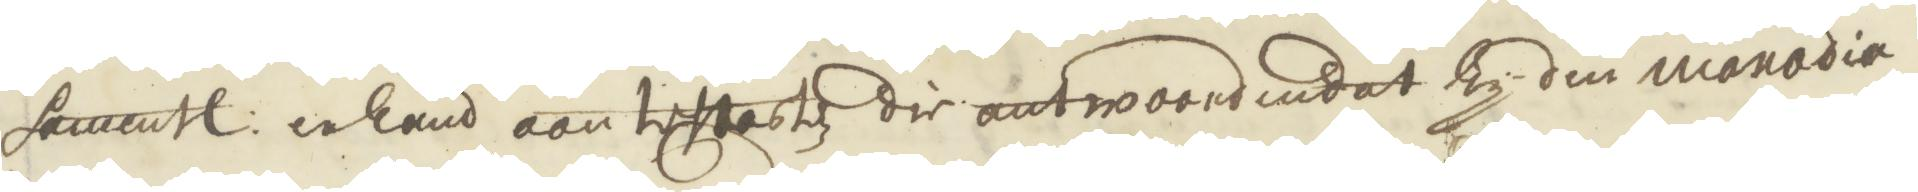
samentlijk erhand aan testasten die antwoord endat hij den maradia
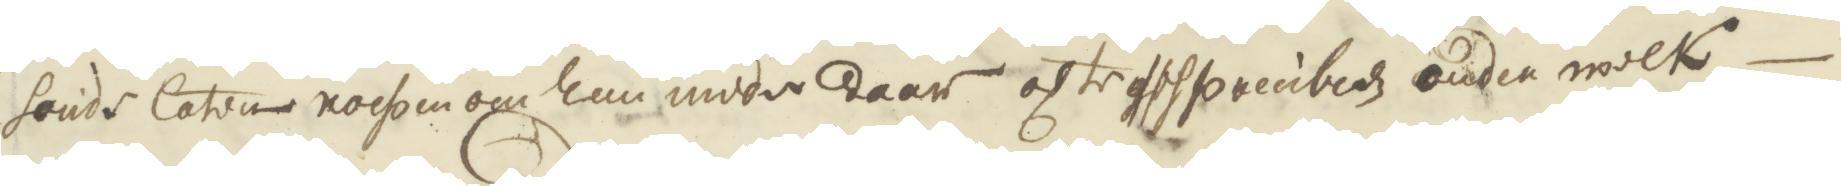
soude laten roepen om hem mede daar over te gespreuken onder welk —
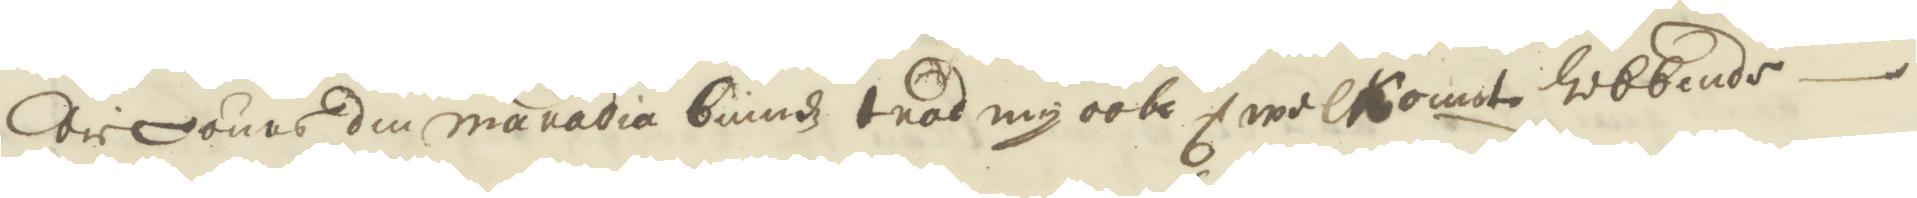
discours den maradia binnen trad mij ook verwelkomst hebbende —
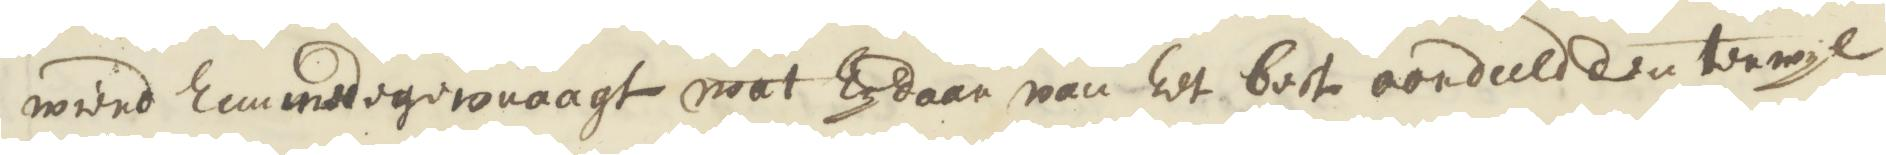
wierd hem medegevraagt wat hy daar van het best oordeeld den terwyl
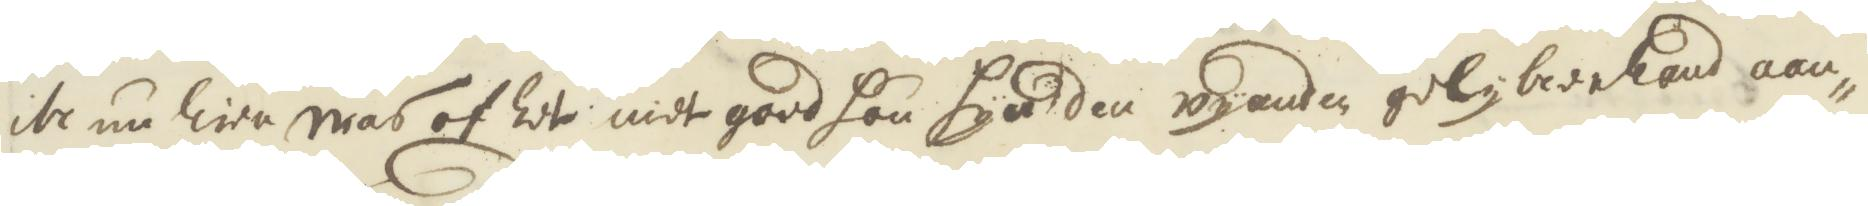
ik nu hier was of het niet goed sou sijn den vijanden gelijkerhand aan„
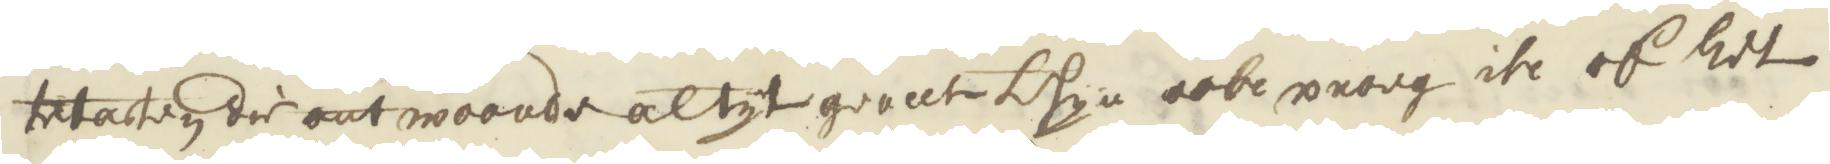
tetasten die antwoorde altijt gereet te sijn ook vroeg ik of het
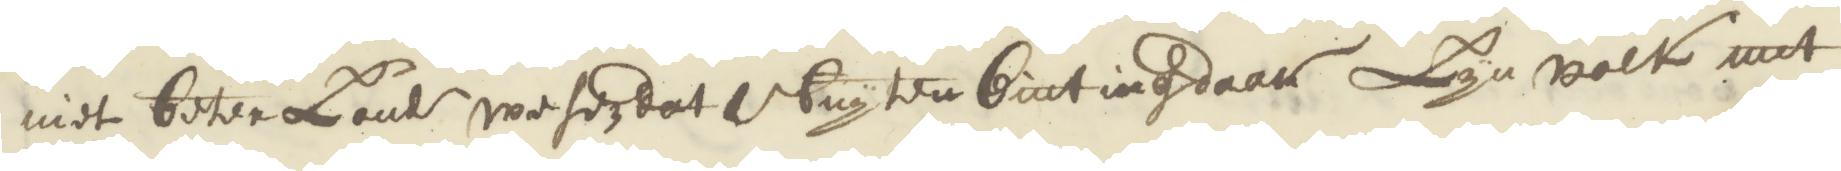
niet beter zoude wesen dat te buijten binting daar zijn volk met
